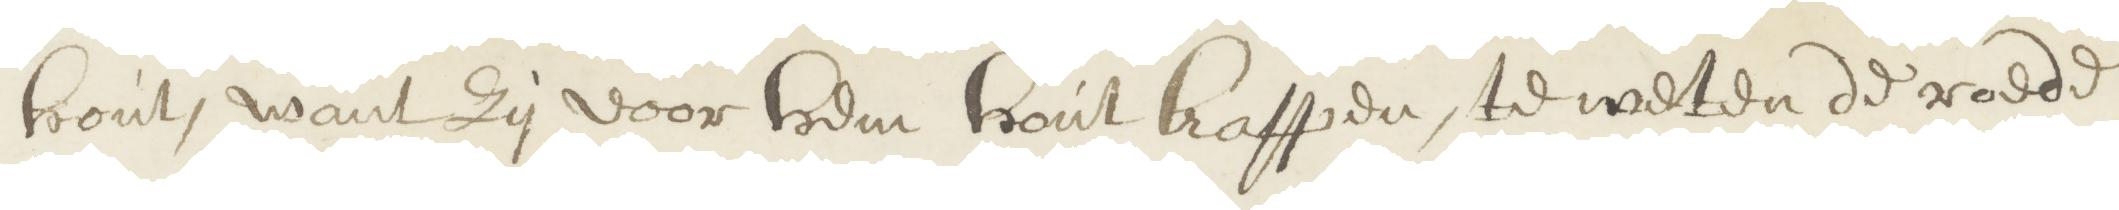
hout, want zij voor hem hout kappen, te weten de roede
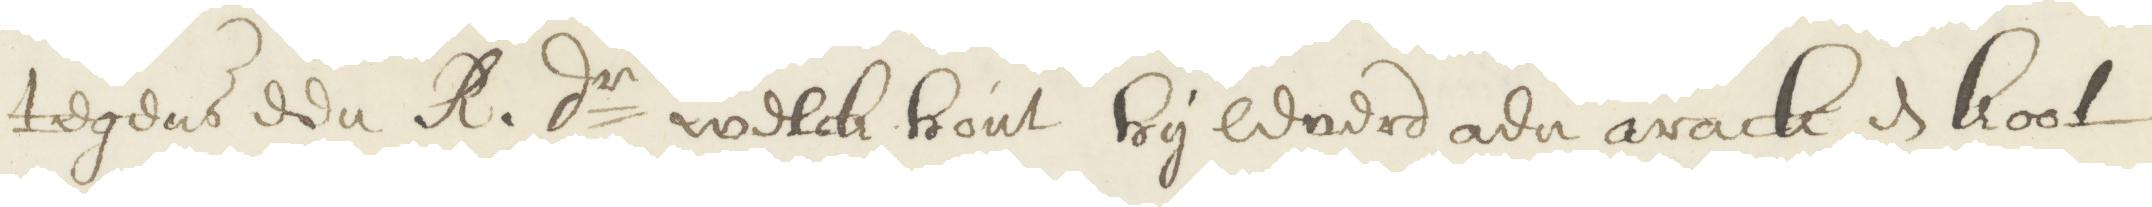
tegens een R. d=r welck hout hij leverd aen arack en kool
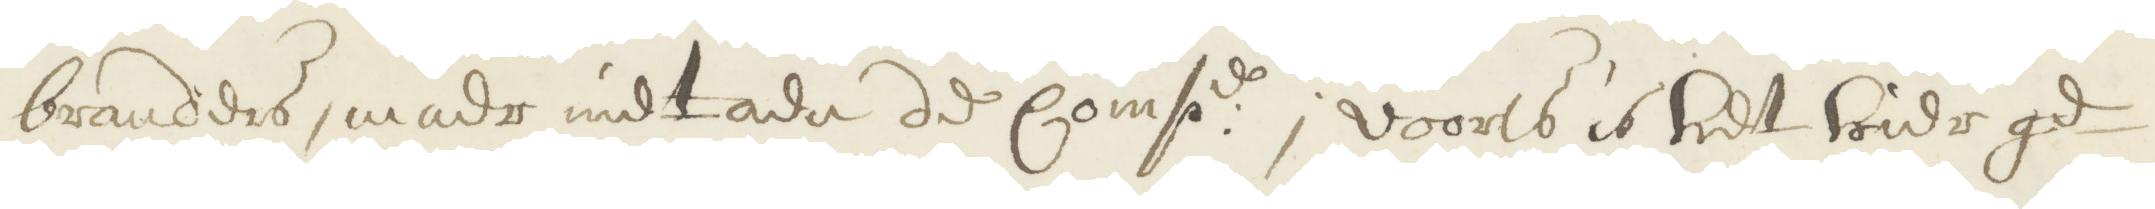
branders, maer niet aen de Comp:e; voorts is het hier g:e
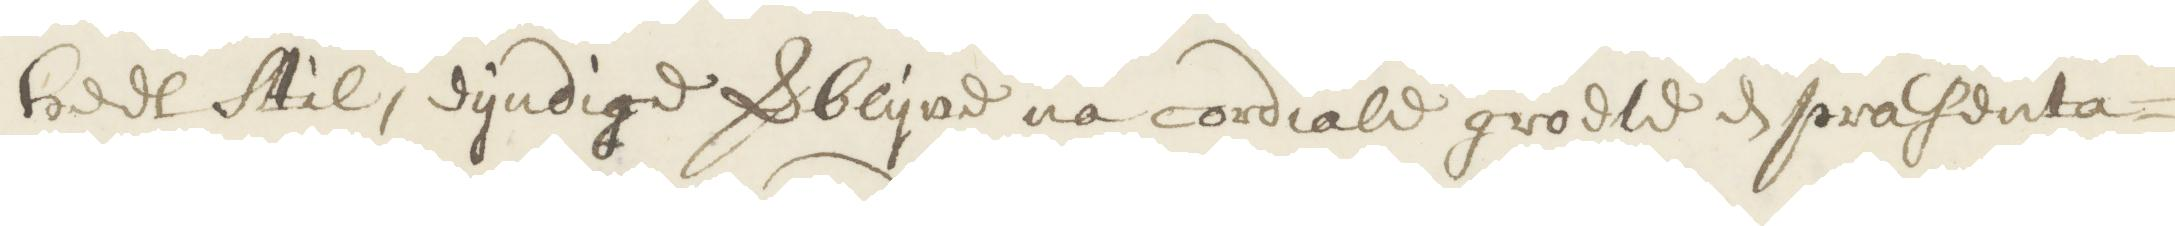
heel stil, eijndige verblijve na cordiale groete en praesenta=
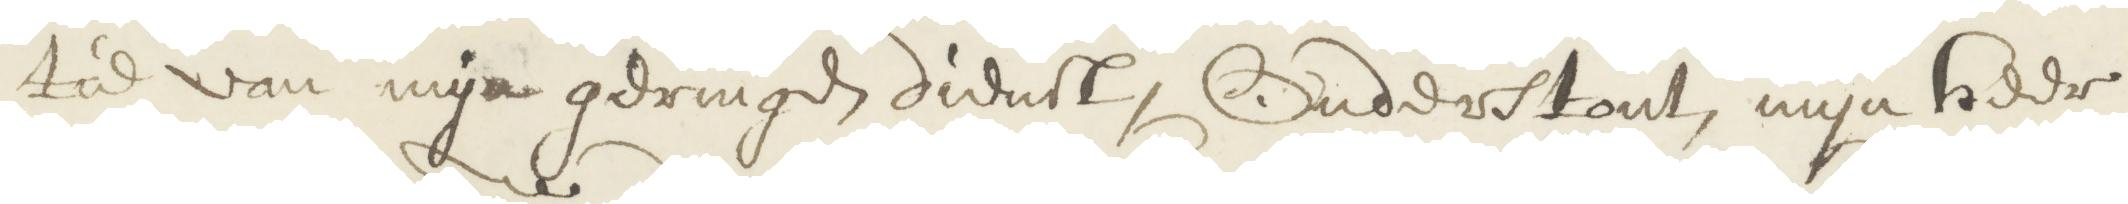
tie van mijn geringen dienst, Onder stont, mijn heer
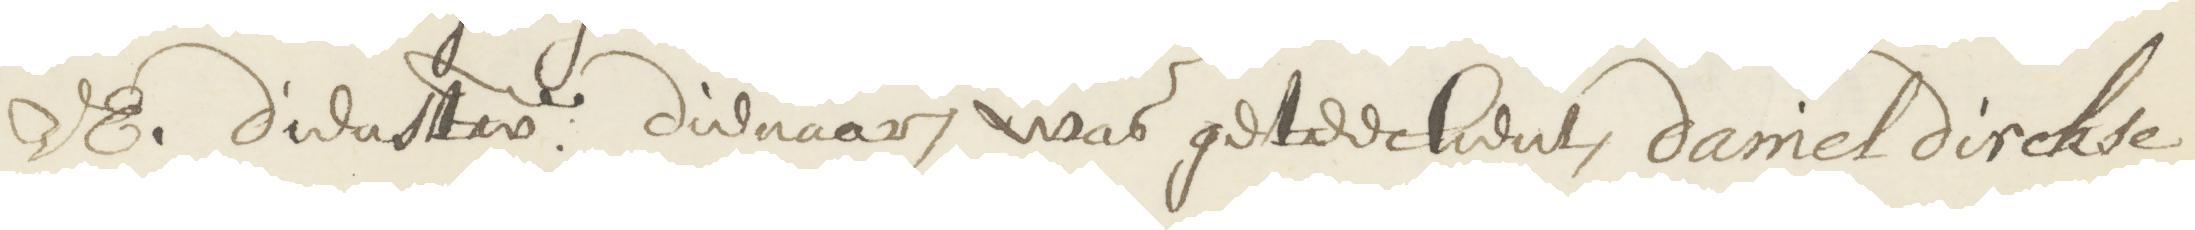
VE. dienstw:e dienaar, was geteeckent, daniel dirckse
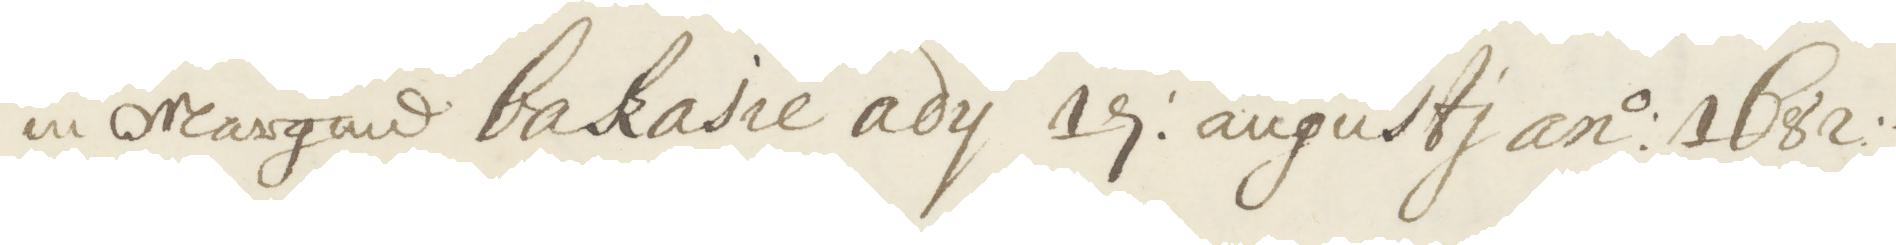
in Margine bakasie adij 17: augustj an:o 1682:
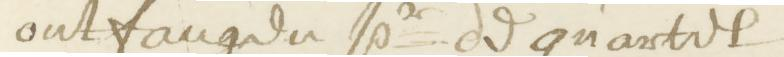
ontfangen p=r de quartel
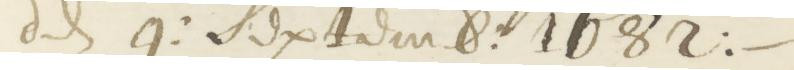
den 9:' Septemb:r 1682:—
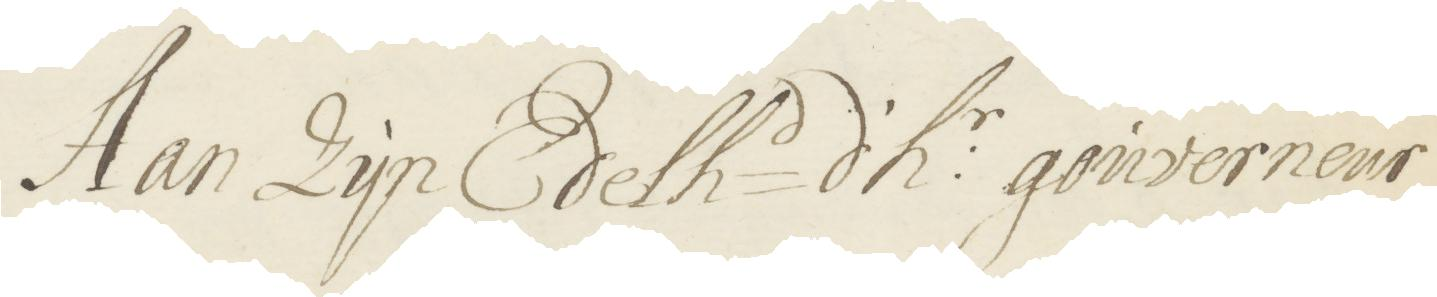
Aan Zijn Edelh=d dh:r gouverneur
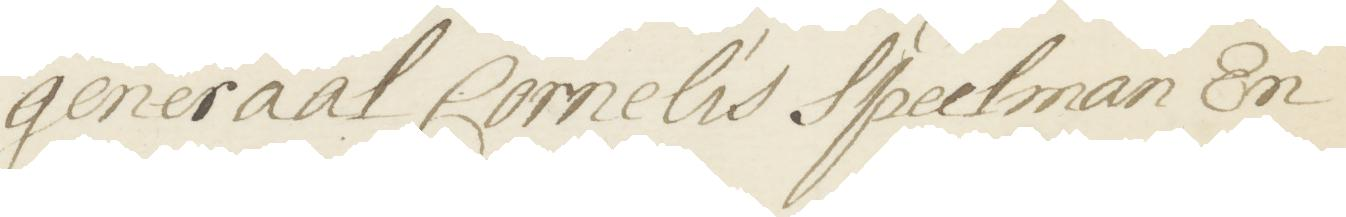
generaal Cornelis Speelman En
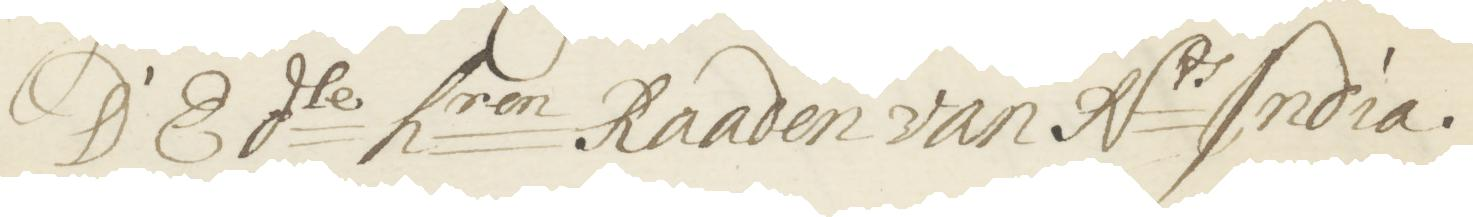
D’Ed=le h=ren Raaden van N=ts Jndia.
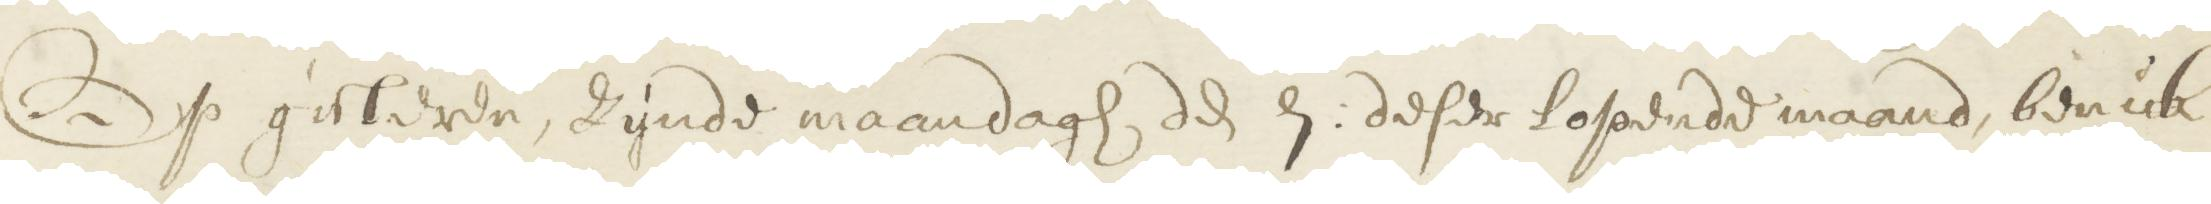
Op gisteren, Zijnde maandagh den 7: deser lopende maand, ben ick
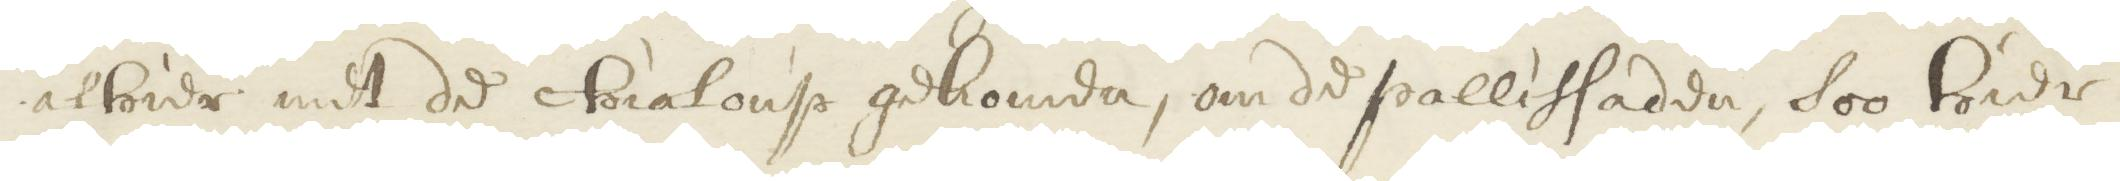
alhier met de chialoup gekomen, om de pallissaden, Soo hier
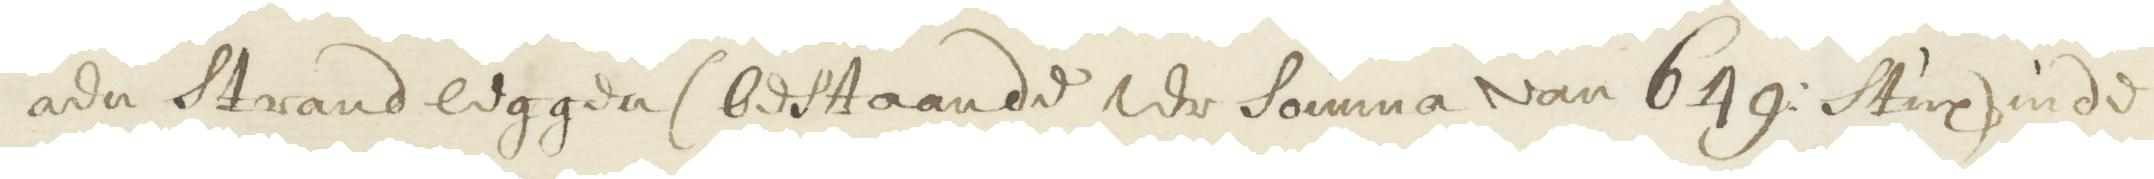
aen Strand leggen (bestaande ter somma van 649: Stux in de
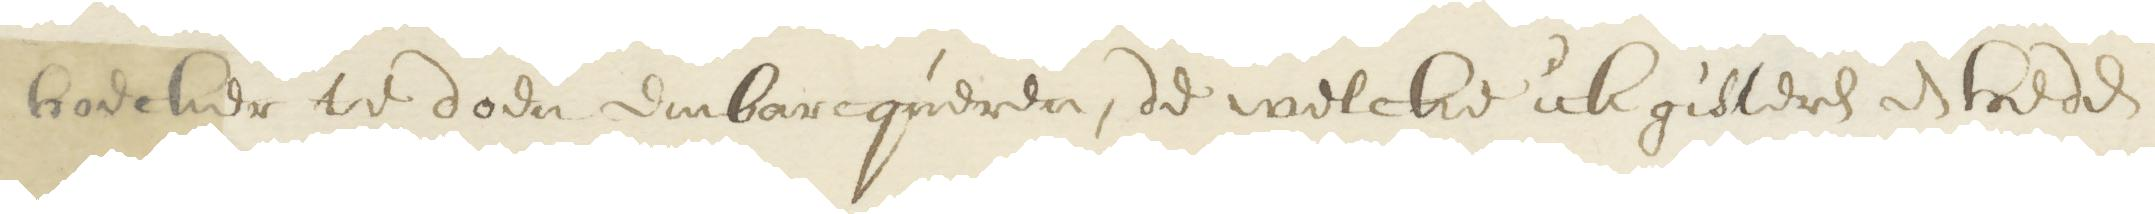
hoecker te doen embarcqueren, de welcke ick gisteren en heden
